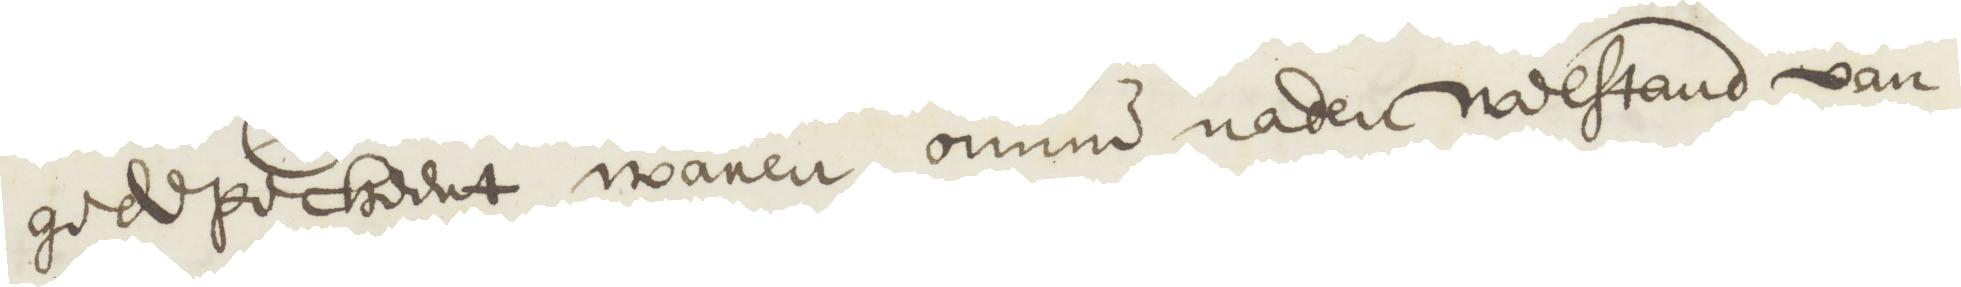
gedepecheert waren, omme naden welstand van
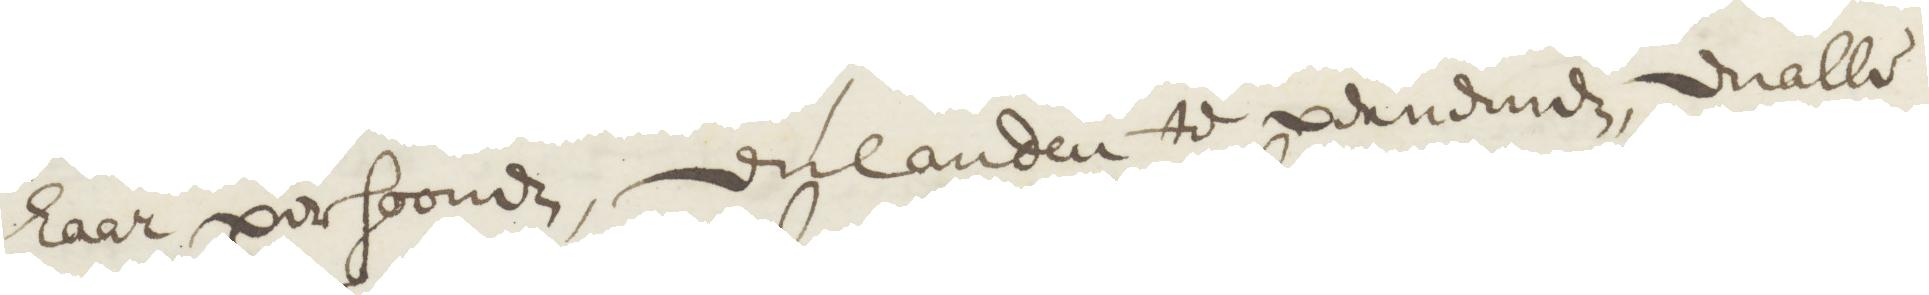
haar persoonen, en landen te vernemen, en alle
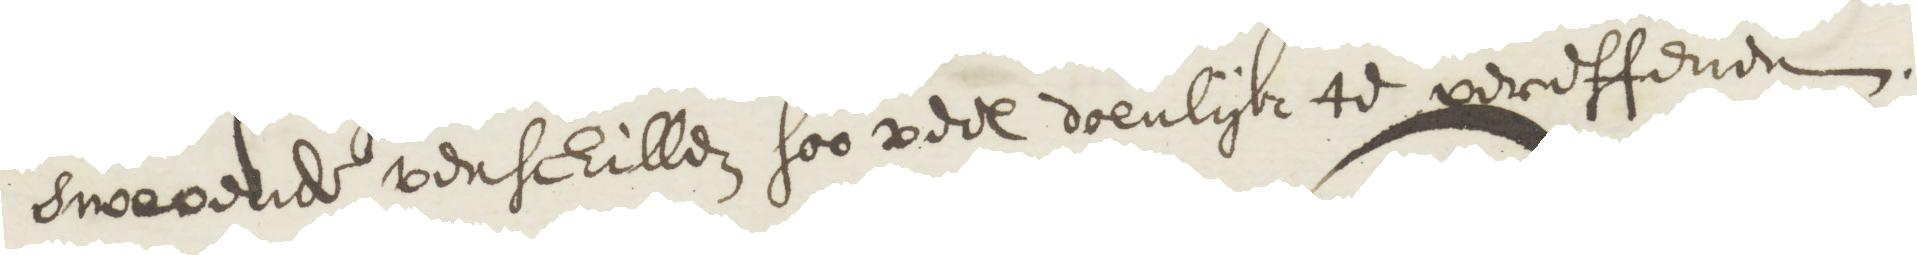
swevende verschillen soo veel doenlijk te vereffenen
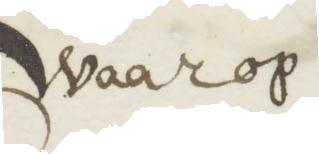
Waarop
